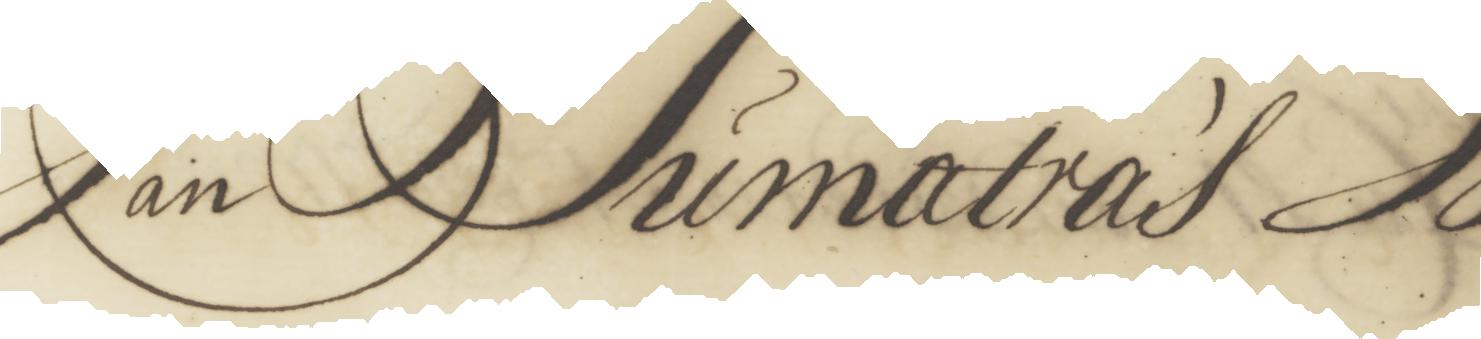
Van Sumatra's W=t
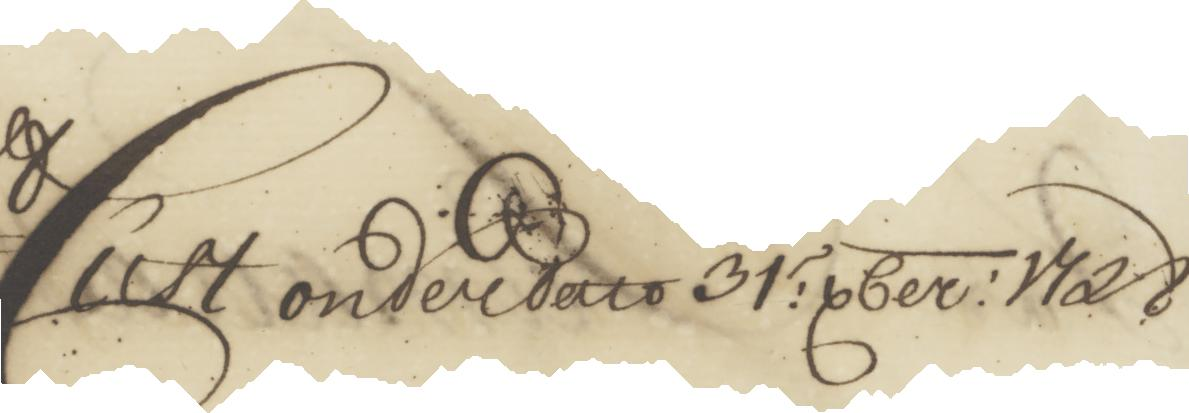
Cust onder dato 31:' xber: 1728
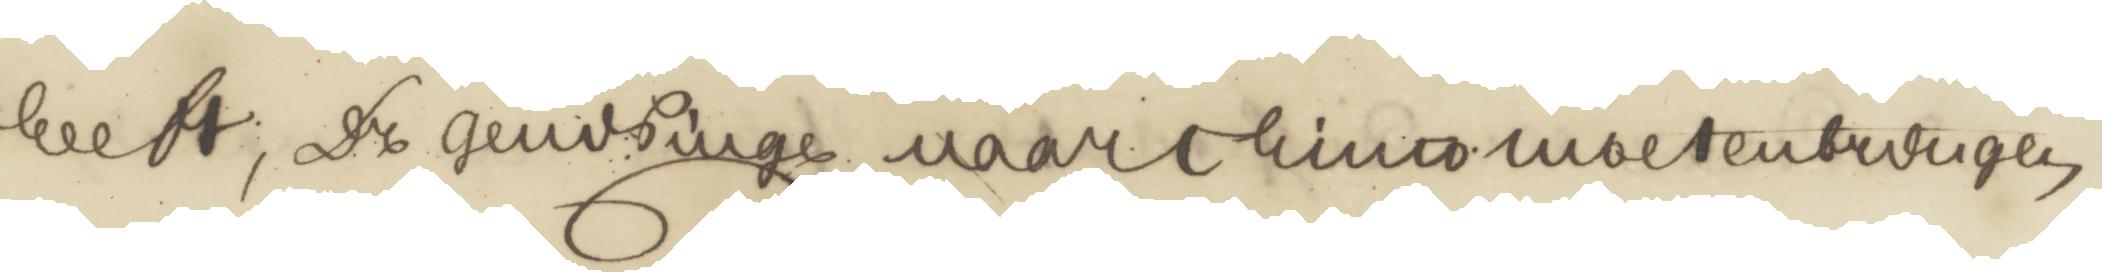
heeft; ter genesinge naar chinco moeten brengen
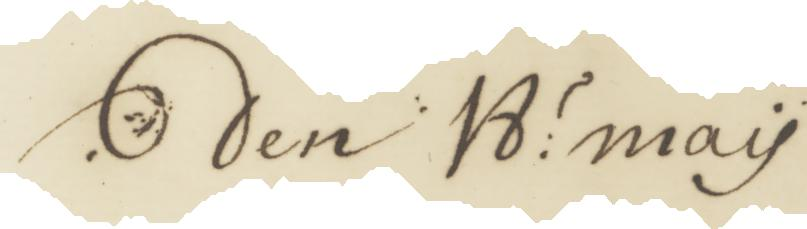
den 18:' maij
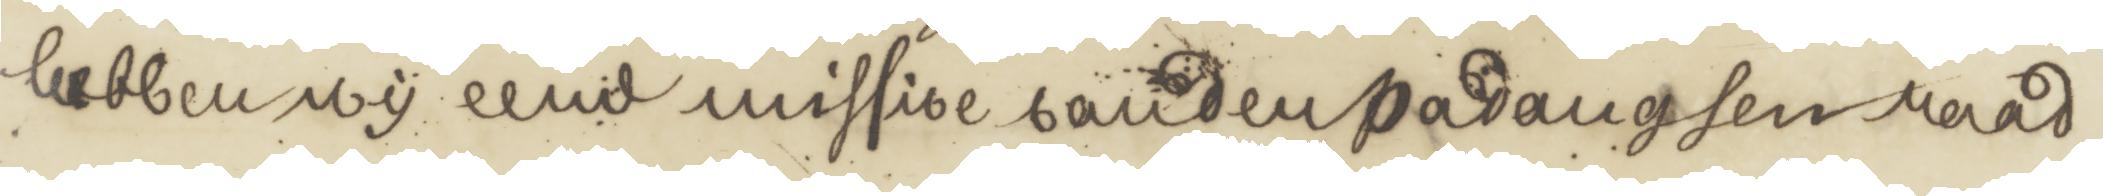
hebben wij eene missive vanden padangsen raad
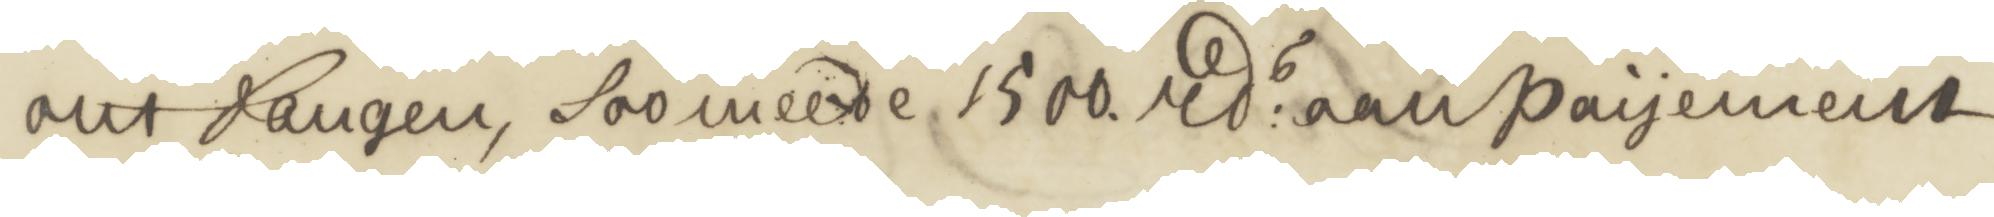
ont fangen, soo meede 1500. rd:s aan paijement
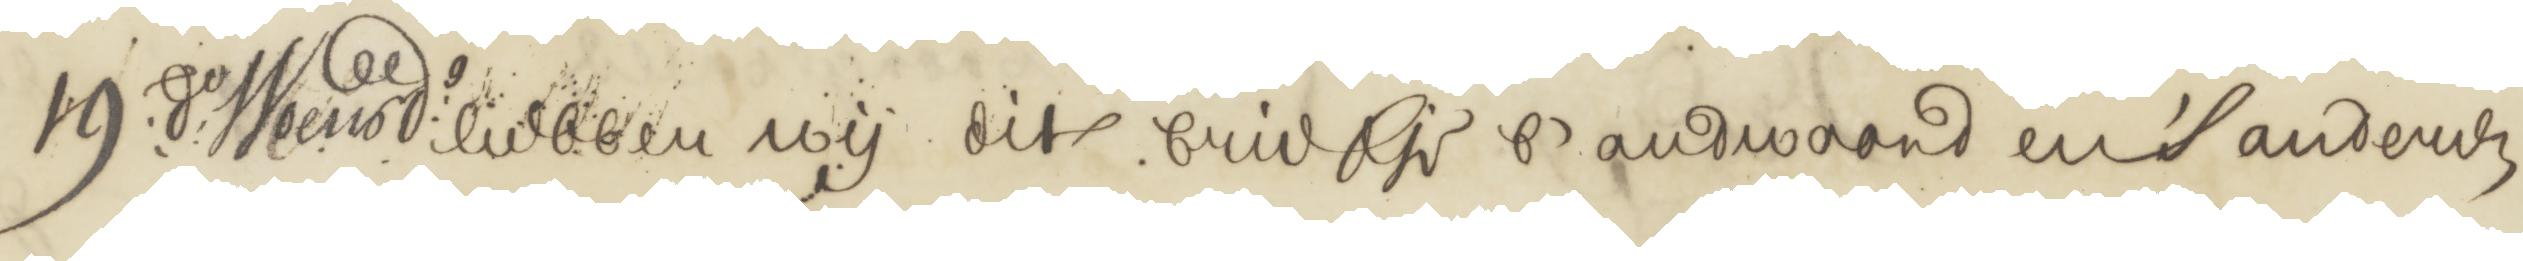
19. d:o Woensd:g hebben wij dit briefje b'andwoord en ’s anderen
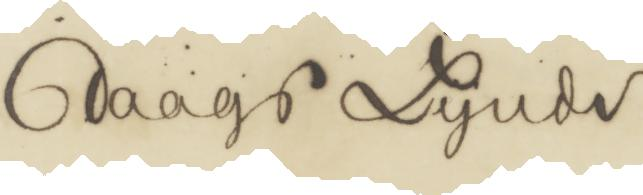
daags Zijnde
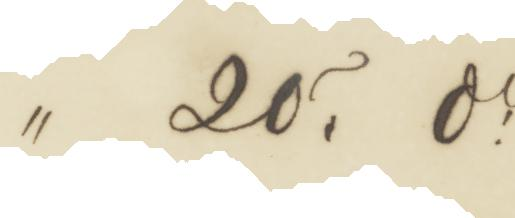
„ 20.' d:o
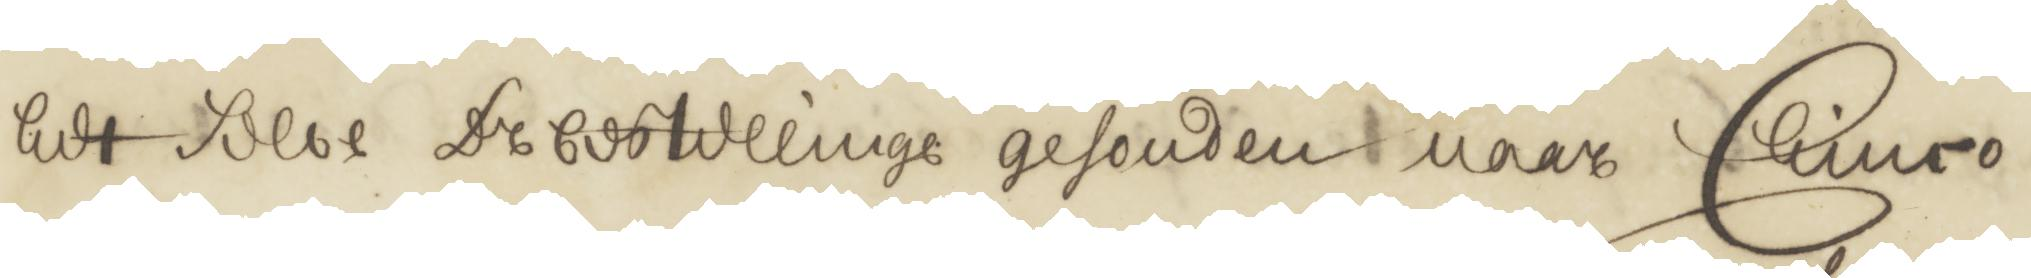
het selve ter bestellinge gesonden naar Chinco
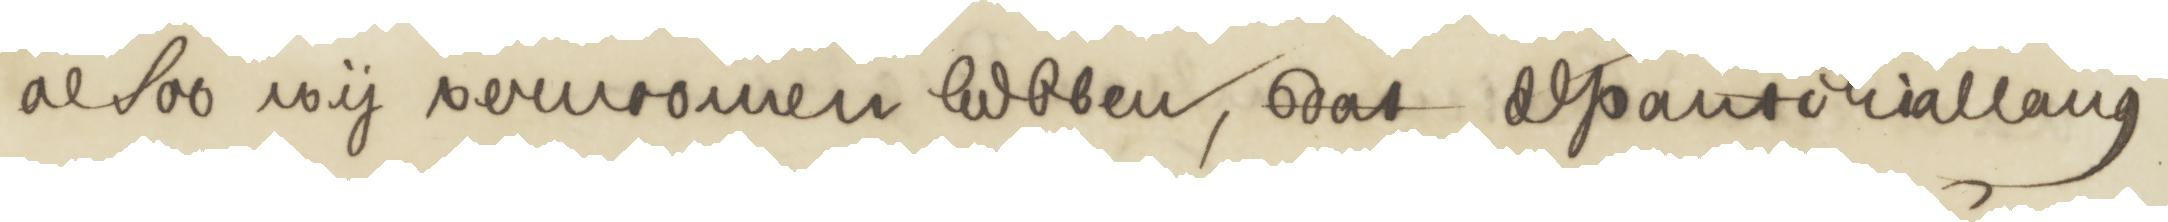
al Soo wij vernoomen hebben, dat depantchiallang
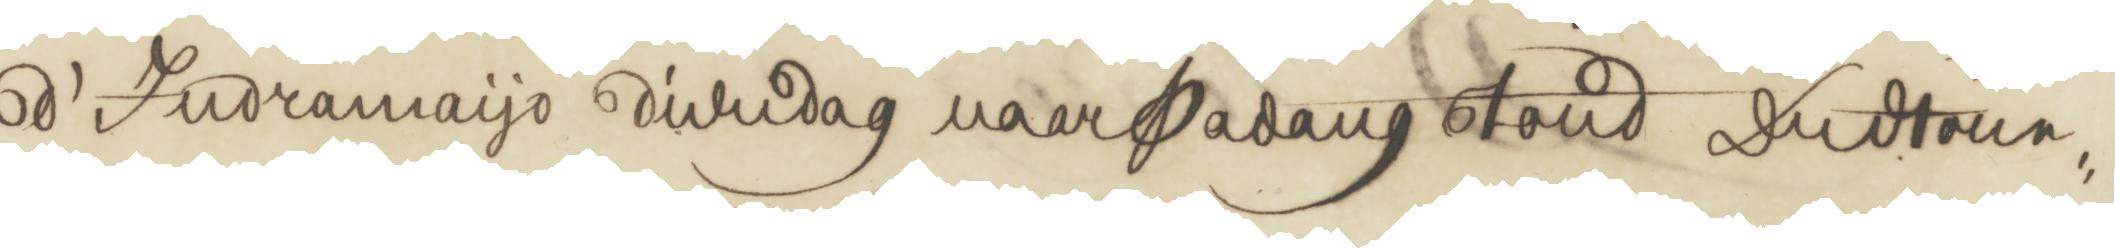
d’ Indramaijo diendag naar Padang stond teretour„
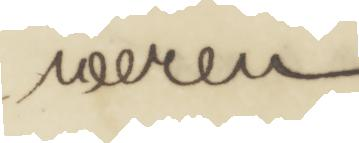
neren
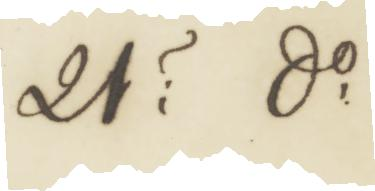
21:' d:o
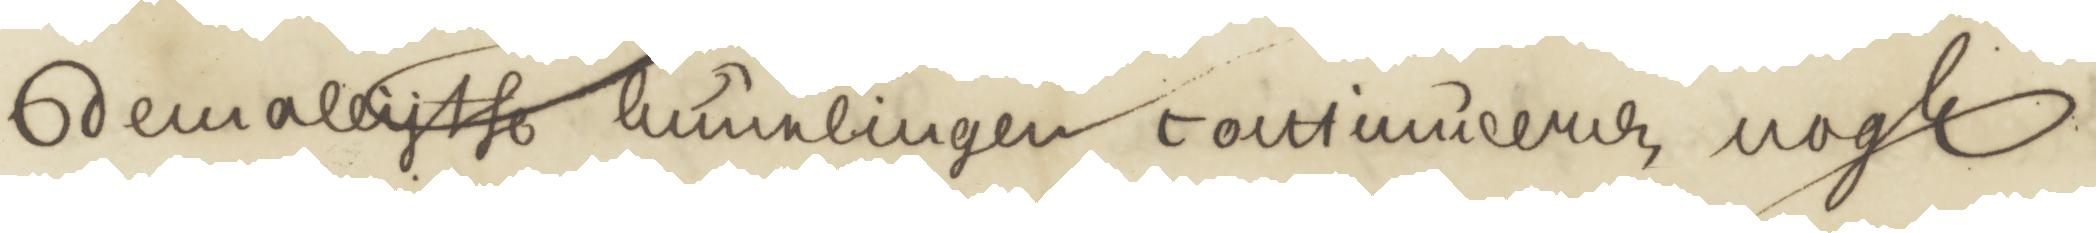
de malijtse huurlingen continueeren nogh
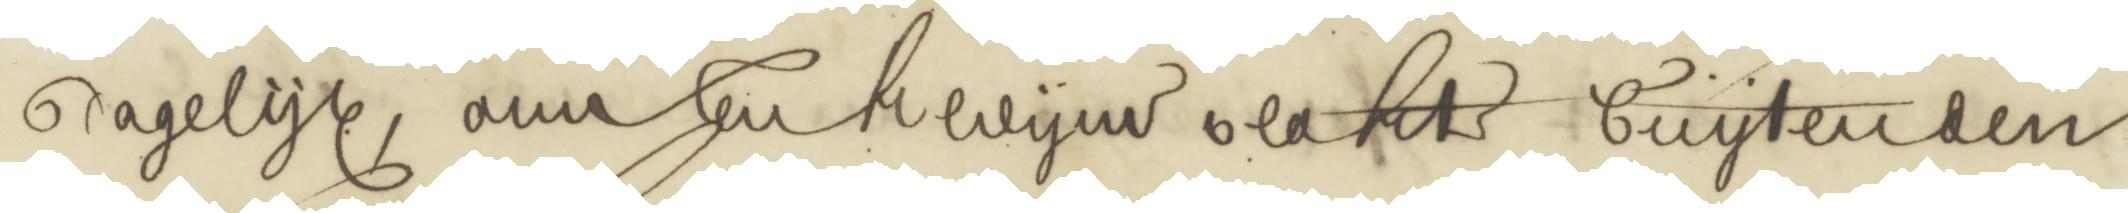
dagelijx, om Een kleijne vlakte buijten den
